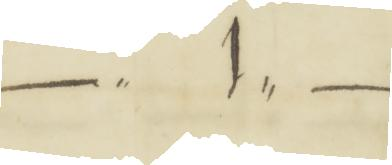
—„ 1„ —
